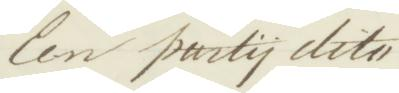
Een partij dito
